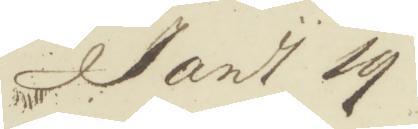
Janij 19
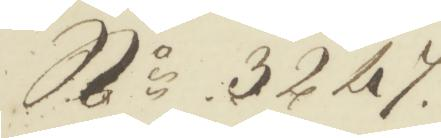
N=o 3247.
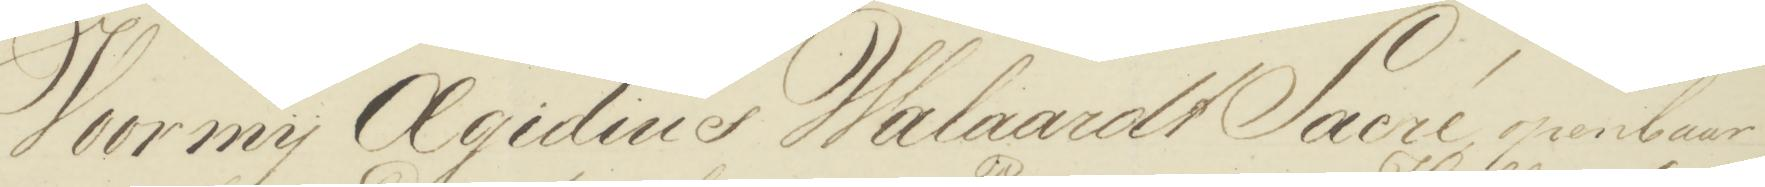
Voor mij Agidius Walaardt Sacré openbaar
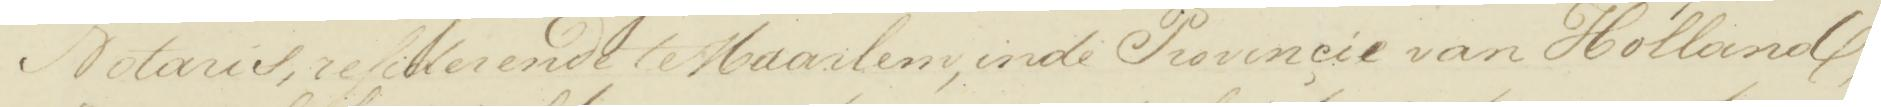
Notaris, residerende te Haarlem, inde Provincie van Holland,
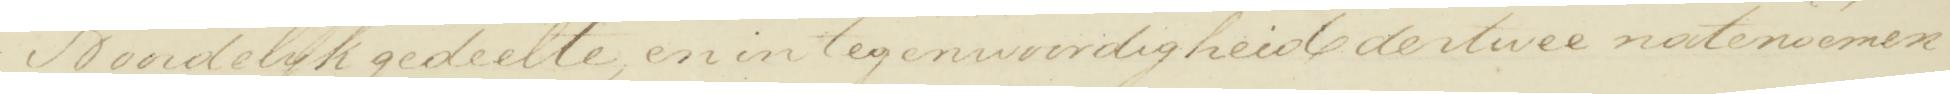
Noordelyk gedeelte, en in tegenwoordigheid der twee natenoemen
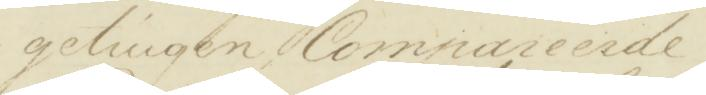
getuigen Compareerde
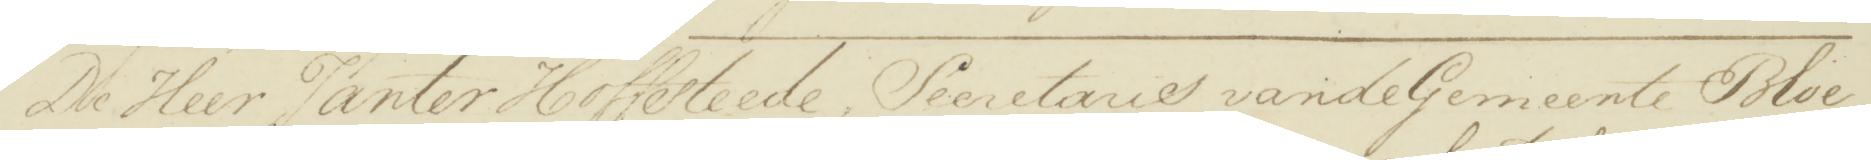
De Heer Jan ter Hoffsteede, Secretaris van de gemeente Bloe,
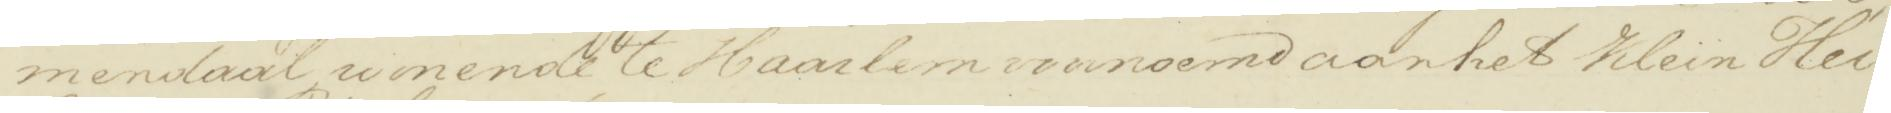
mendaal wonende te Haarlem voornoemd aan het Klein Hei
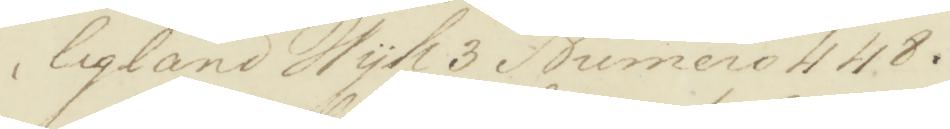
,ligland Wijk 3 Numero 448.
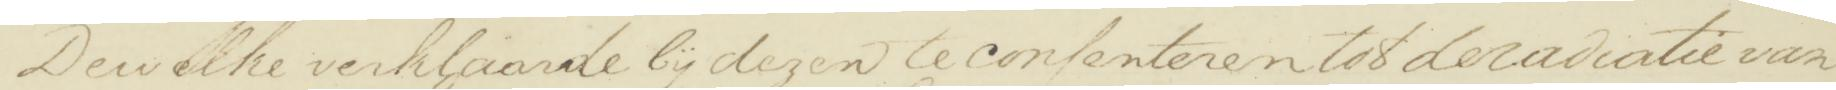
Dewelke verklaarde bij dezen te consenteren tot deradiatie van
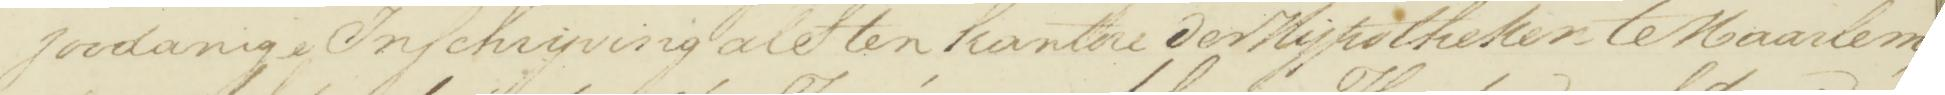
soodanige Inschrijving als ten kantore der Hypotheker te Haarlem,
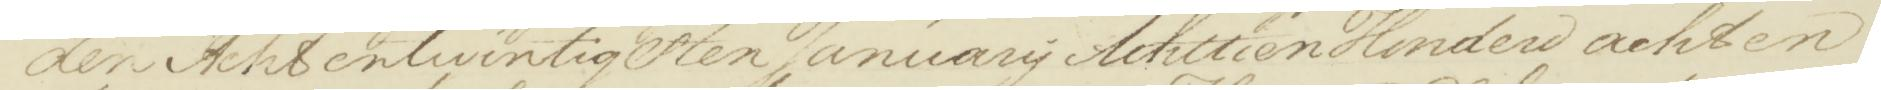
den Achtentwintigsten Januarij Achttien Honderd acht en
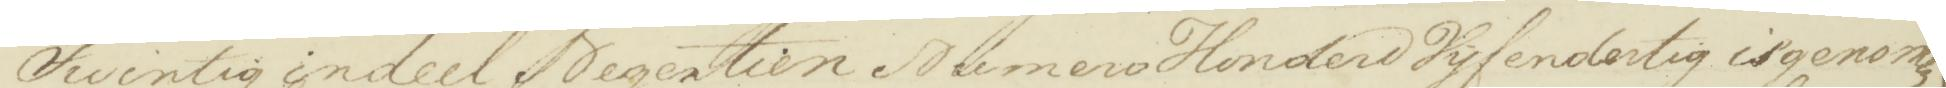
Twintig in deel Negentien Numero Honderd Vyf en dertig is genomen,
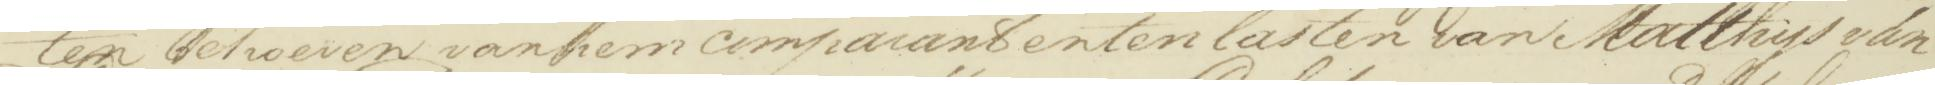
ten behoeven van hem comparant en ten lasten van Matthijs van
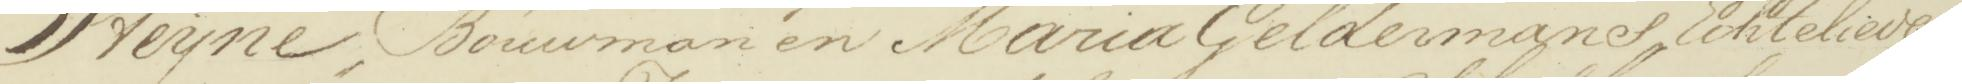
Steyne Bouwman en Maria Geldermans, Echtelieden,
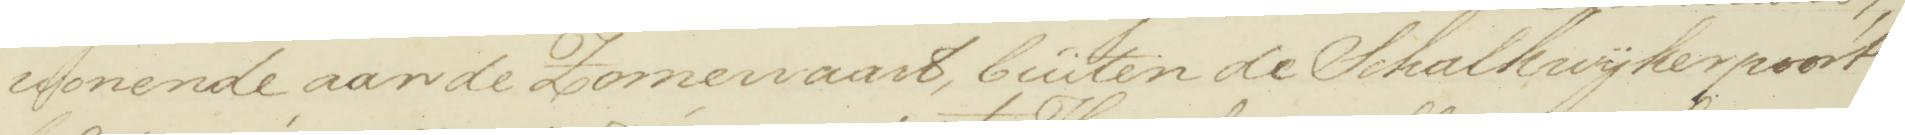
wonende aan de Zomervaart, buiten de Schalkwijkerpoort
